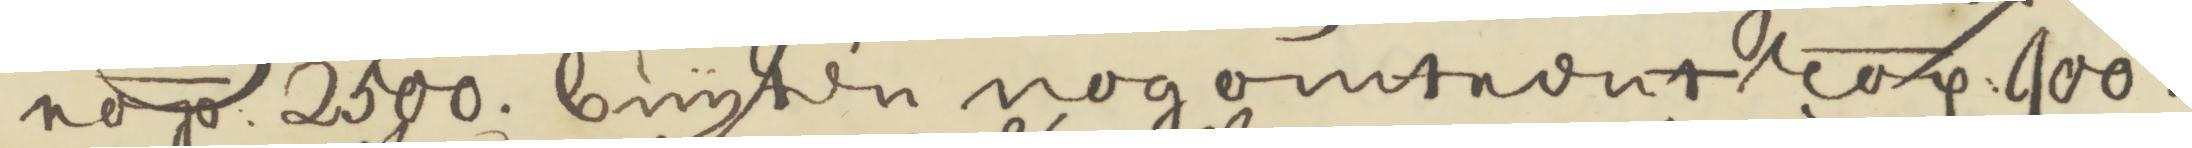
rop. 2500: buijten nog omtrent rop: 400.
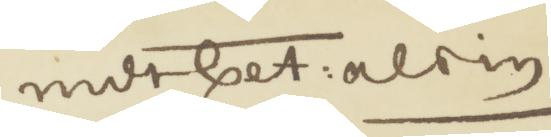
met bet: als in
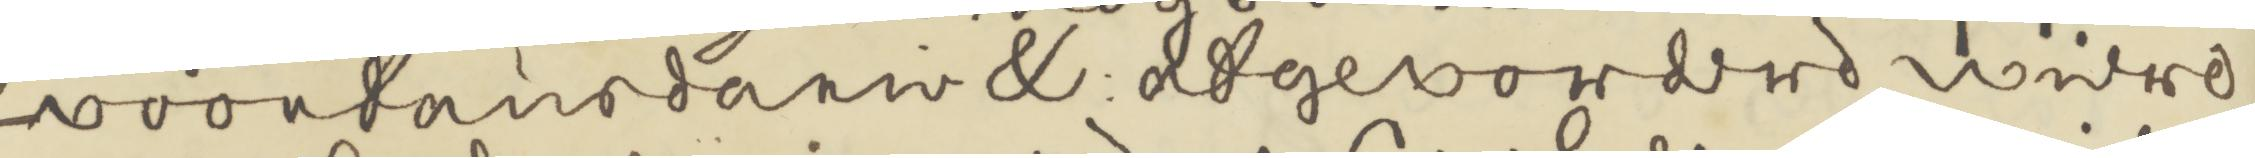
voor fausdarie &: afgevorderd wierd
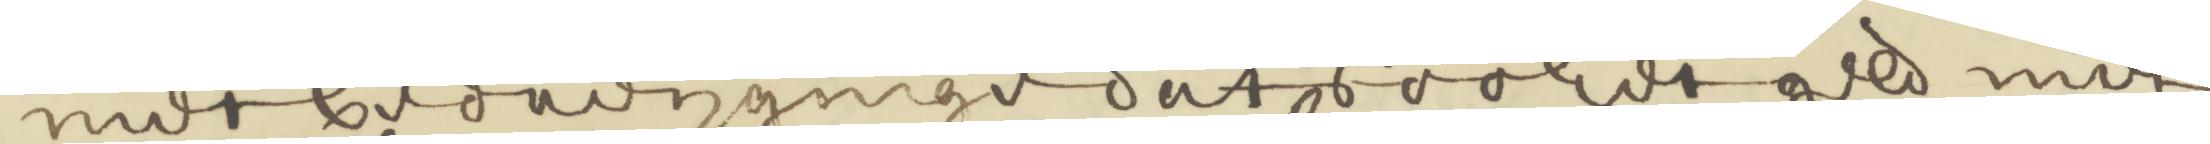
met bedreijginge dat soo het geld niet
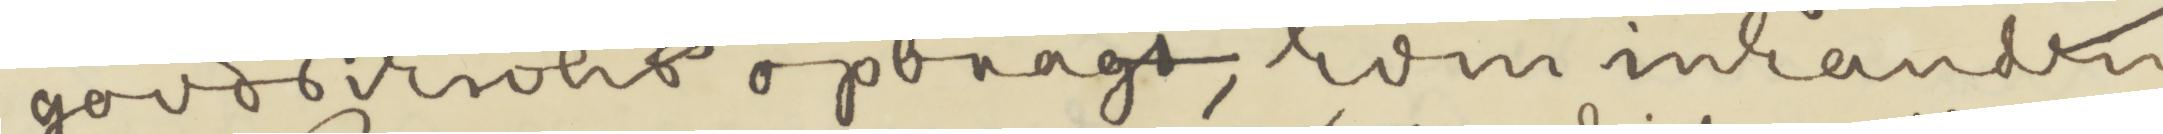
goedschicks opbragt, hem inhanden
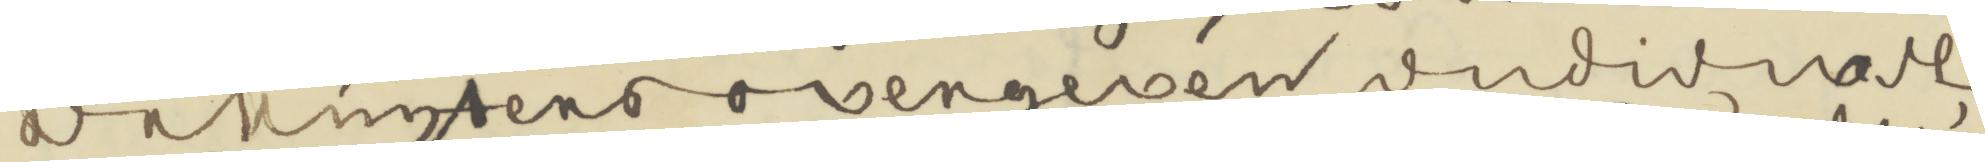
der ruyters overgeven en die wel
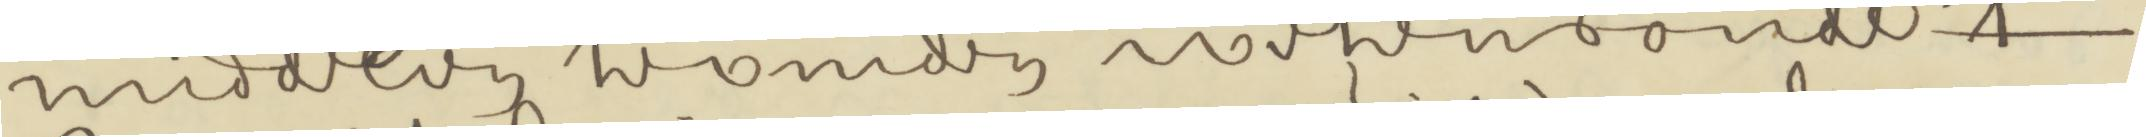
middelen tevinden weten soude 't
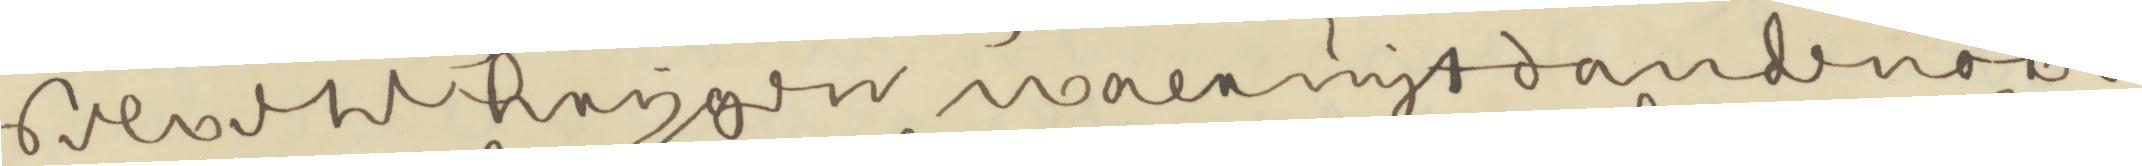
selve te krijgen waeruijt dan denovo
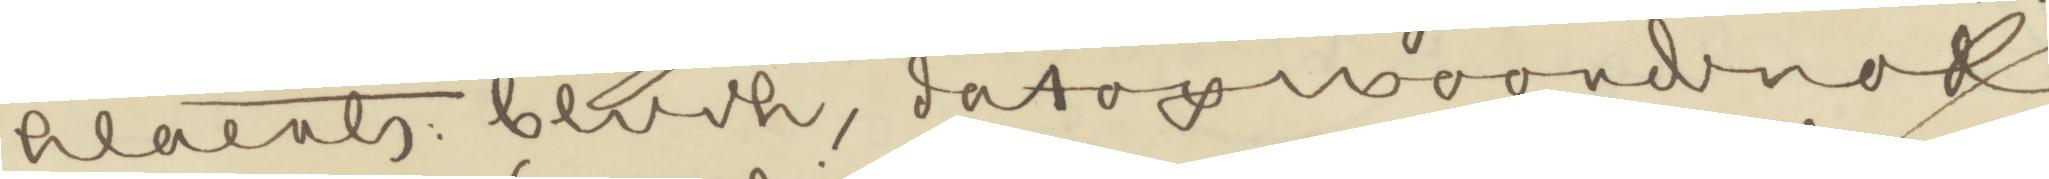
klaerlijk bleek, dat op woorden of
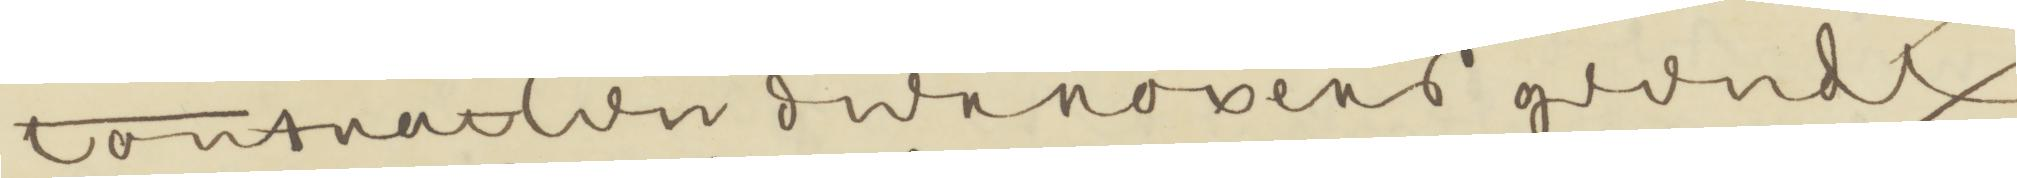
contracten dier rovers geende
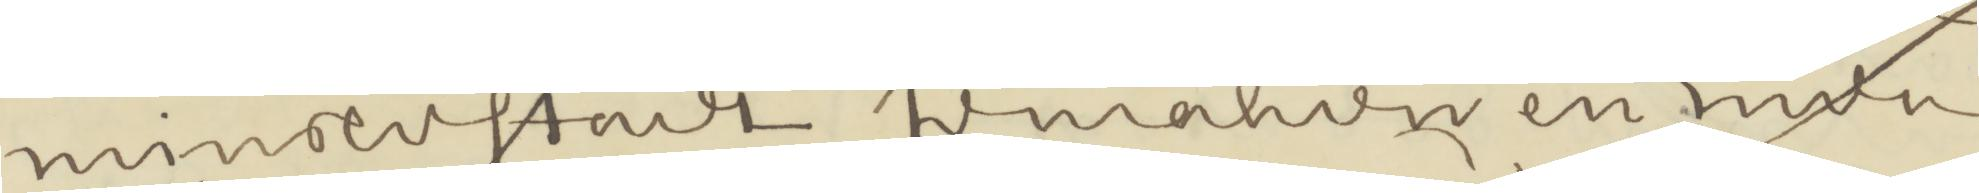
minste staet temaken en men
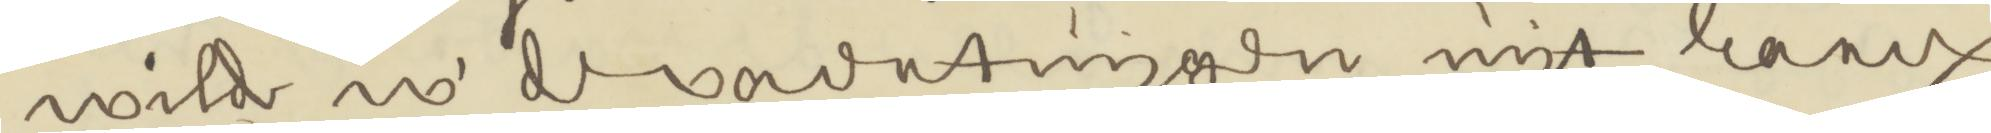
wilde w' de vaertuijgen uijt hare
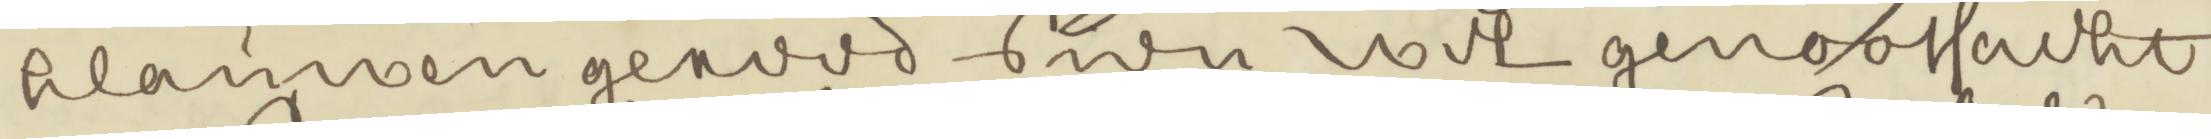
klauwen gereed sien wel genootsaekt
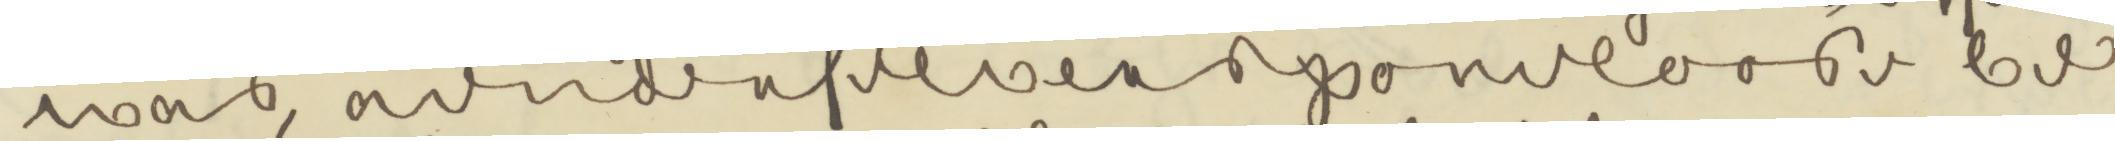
was, aen derselver sporeloose be
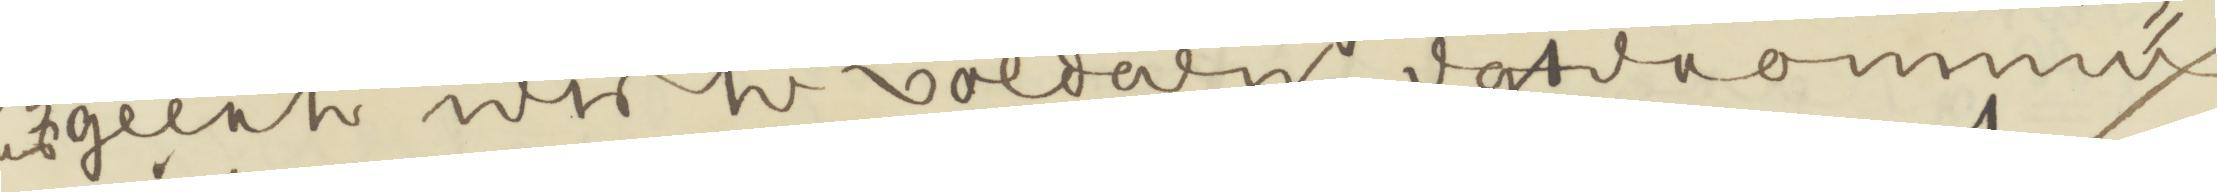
geerte iets te voldoen, egter omme
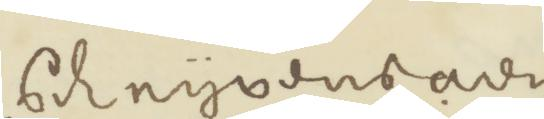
schrijvens aen
